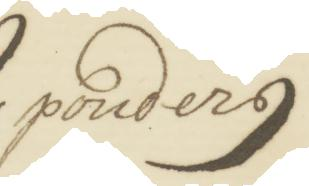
ponders
